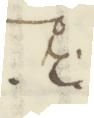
r:o
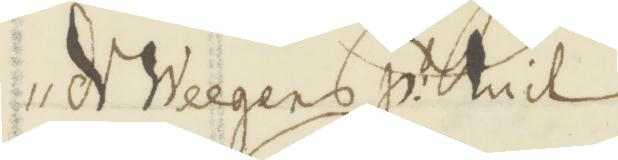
„ de Weegers p:s mil
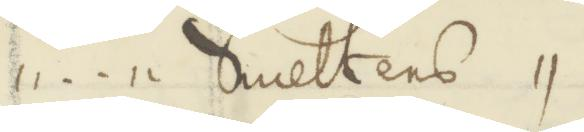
„ . . „ smelters „
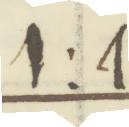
1: 4
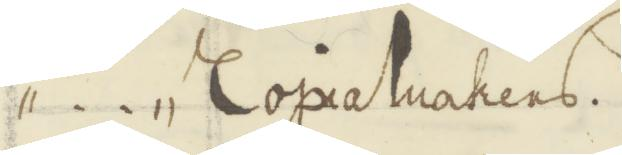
„ - - „ ropiamakers .
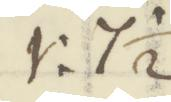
1: 7½
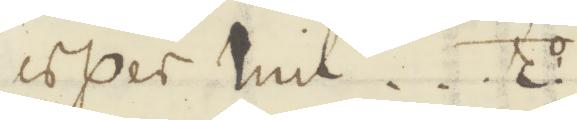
is per mil . . . r:o
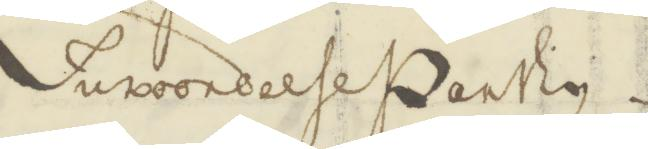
En voor deese Parthij
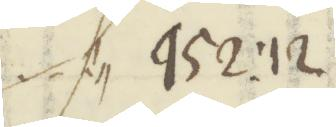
- ƒ„ 452:12
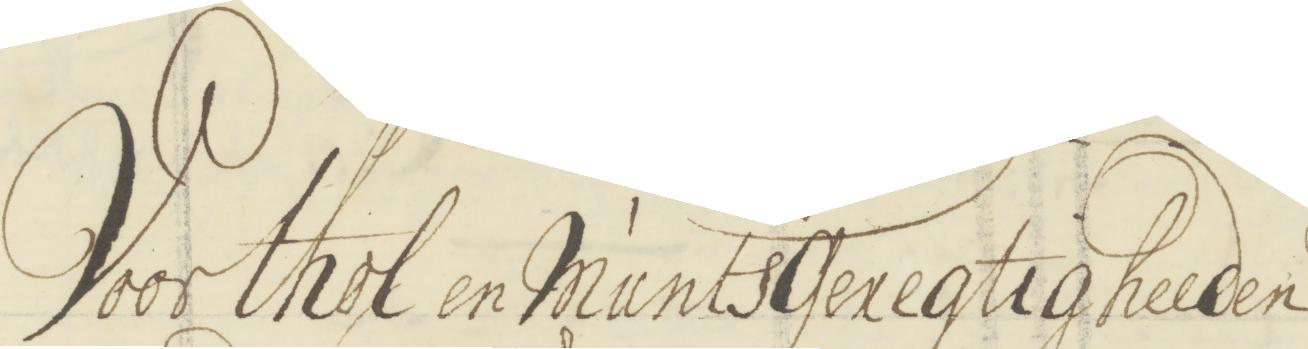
Van thol en munts geregtigheeden
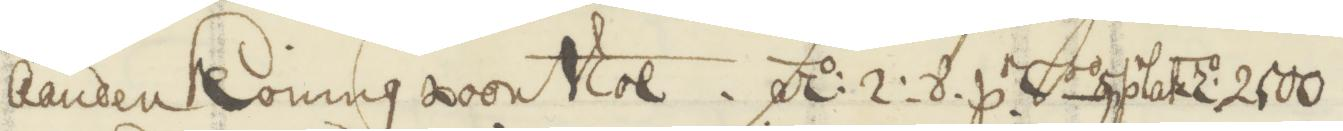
aanden Koning voor thol - a r:o 2: 8. p.rC_to op plak r.o 2500
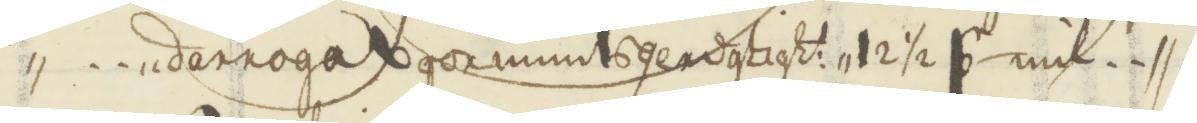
„ - - darroga voor munts geregtigh:t „ 12½ p-r mil - - „
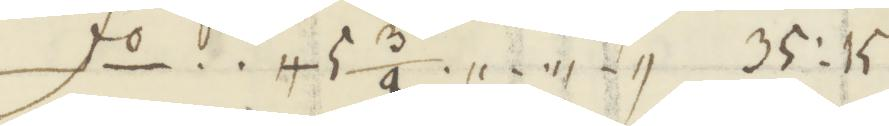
_-o . . „–5¾ . „ - . „ - „ 35:15
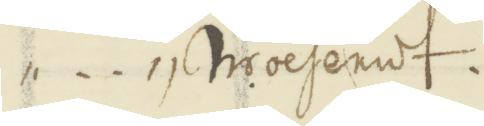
„ - - „ moeserief
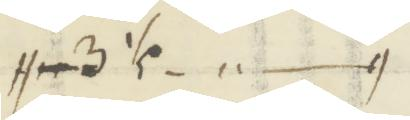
„–3 1/5 - „ — „
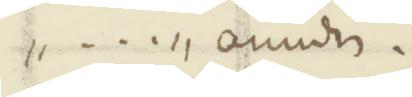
„ - - . „ annen .
